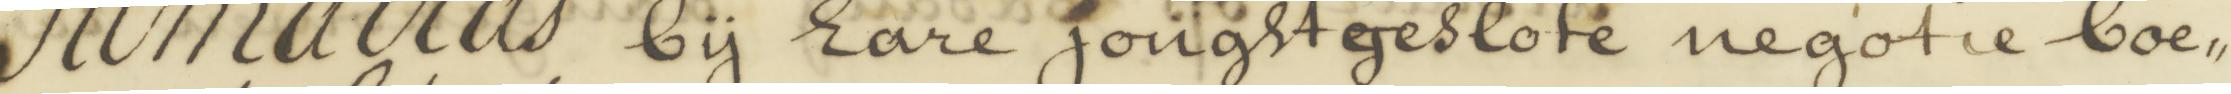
Sumatras bij hare jonghstgeslote negotie boe„
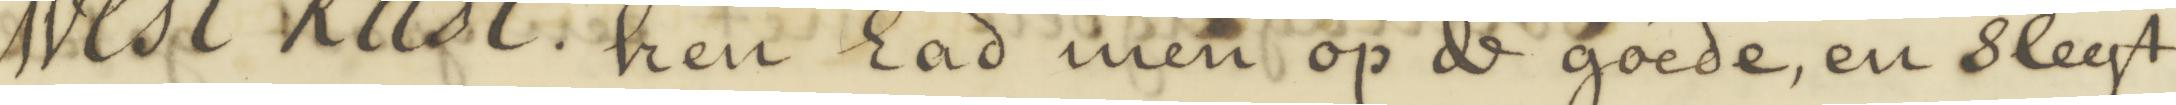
west kust. ken had men op de goede, en slegt
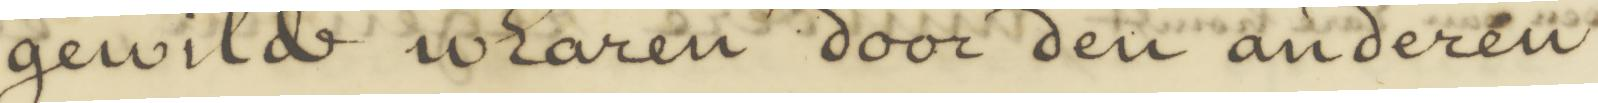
gewilde wharen door den anderen
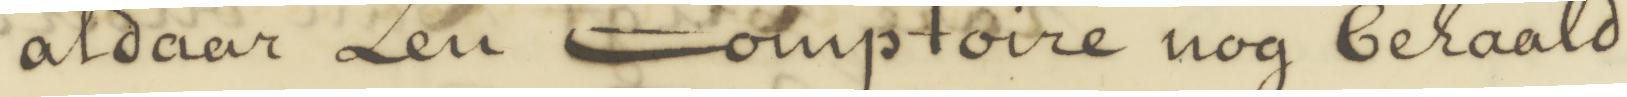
aldaar ten Comptoire nog behaald
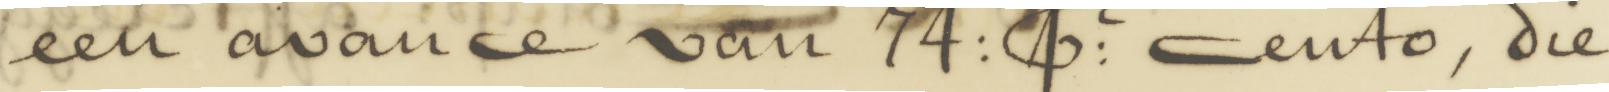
een avance van 74: P:r Cento, die
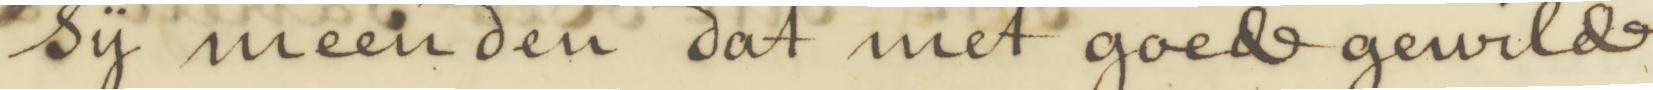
sij meenden dat met goede gewilde
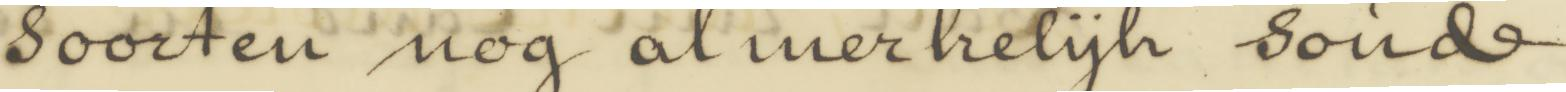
soorten nog al merkelijk soude
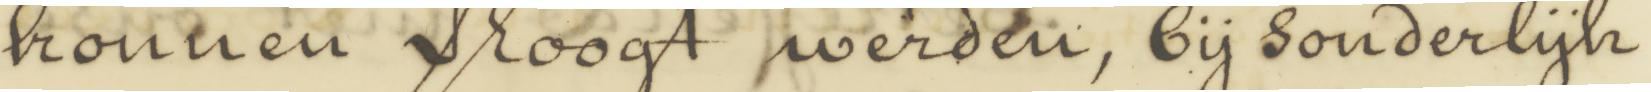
konnen verhoogt werden, bijsonderlijk
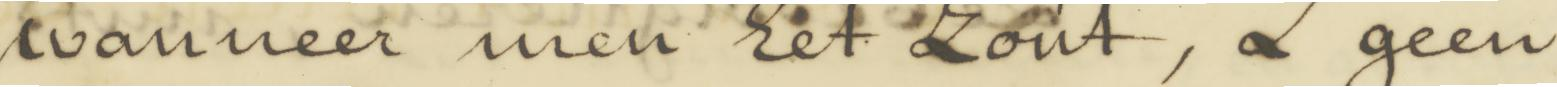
wanneer men het zout, 't geen
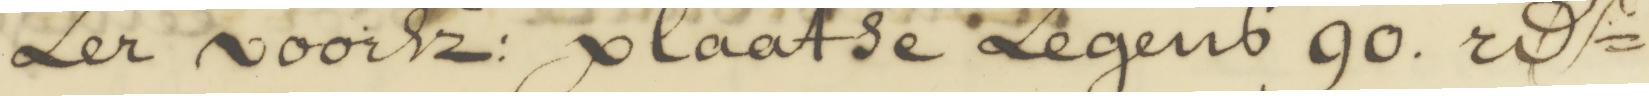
ter voorhz: plaatse tegens 90. rx=s
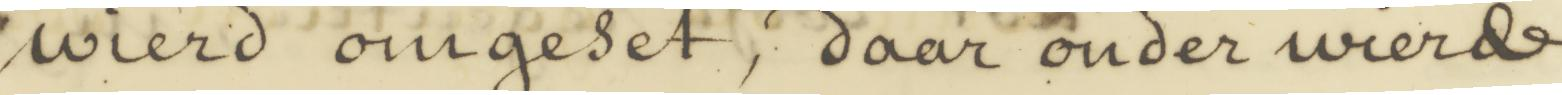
wierd omgeset, daar onder wierde
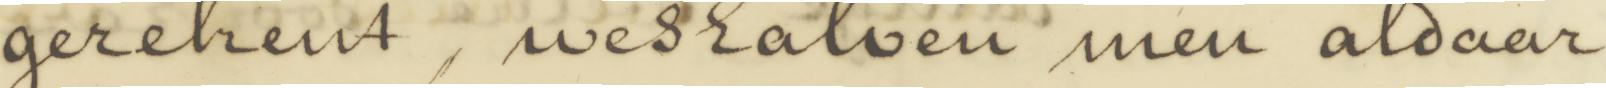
gerekent„ weshalven men aldaar
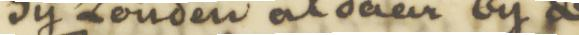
hij zouden aldaar bij de
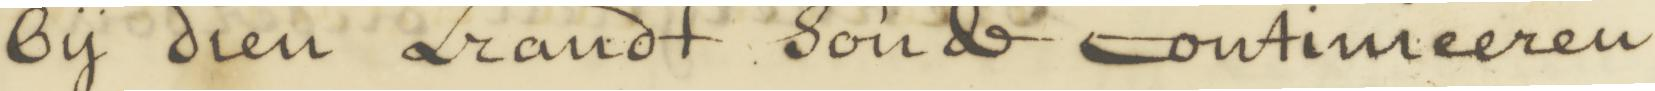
bij dien trandt soude continieeren
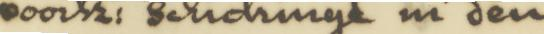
voorhz: schickinge in den
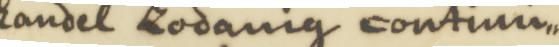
handel zodanig continu„
